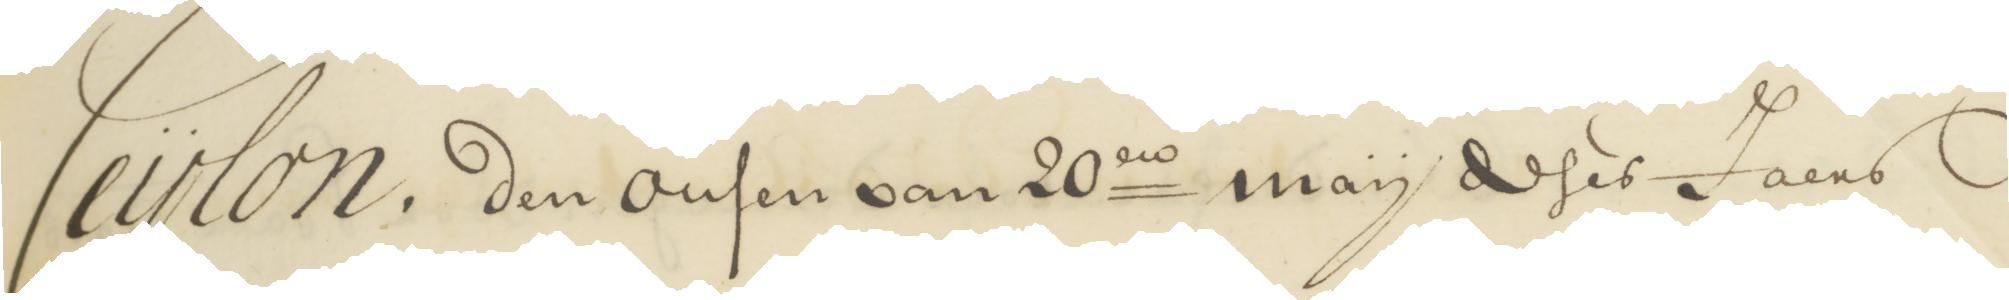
Ceijlon, den onsen van 20=en maij deses Jaers
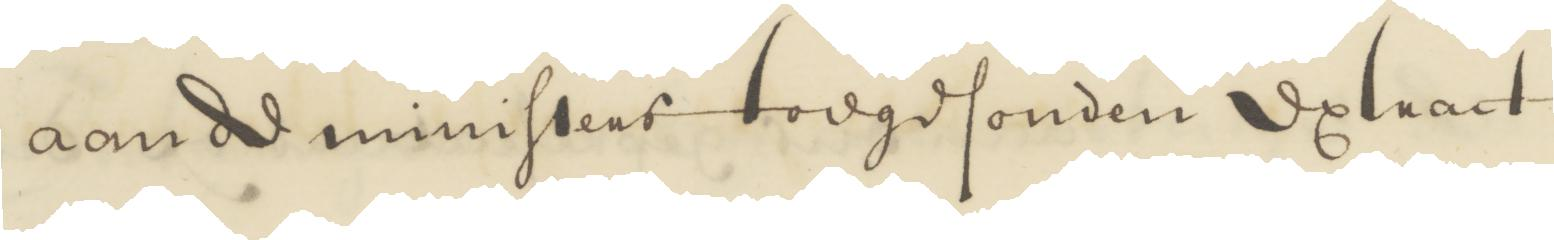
aan de ministers toegesonden Extract
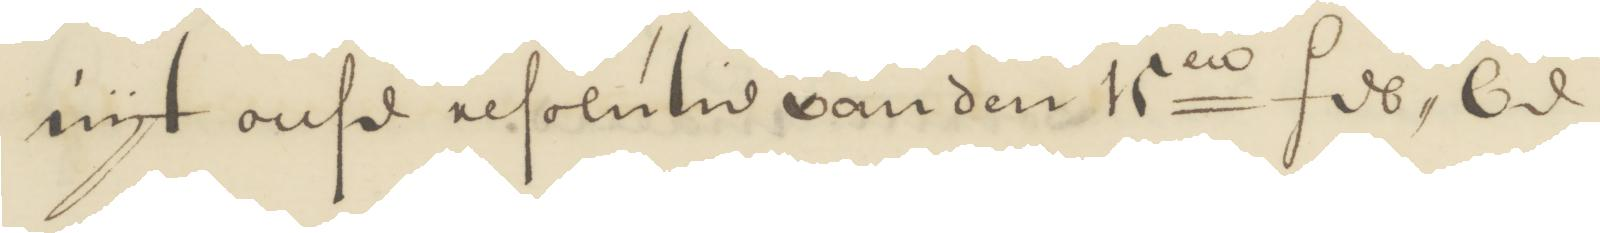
uijt onse resolutie van den 15=en feb„r be
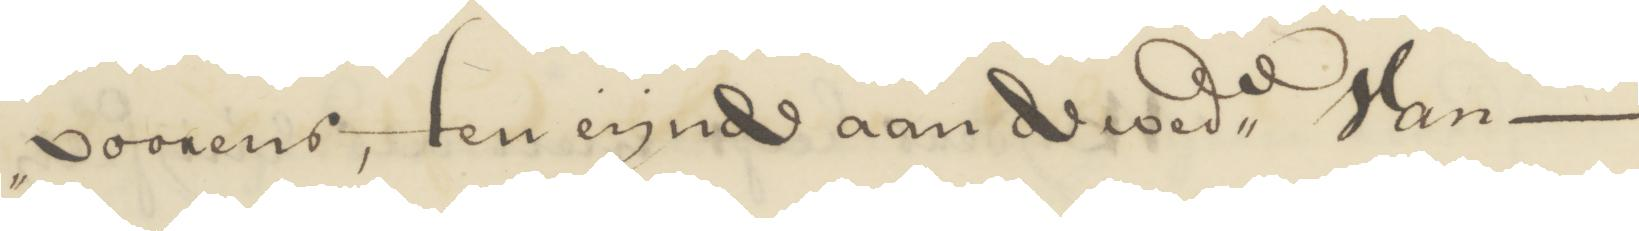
„ voorens, ten eijnde aan de wed„e Van
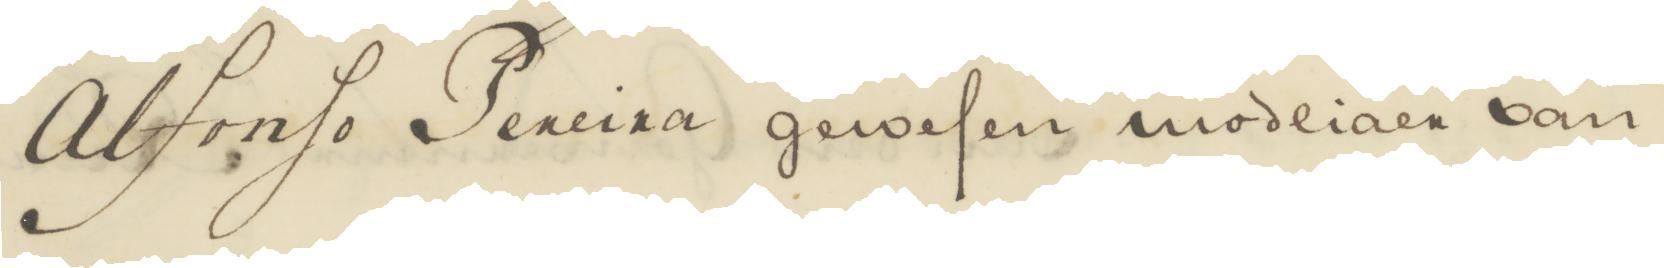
Alfonso Pereira gewesen modliaer van
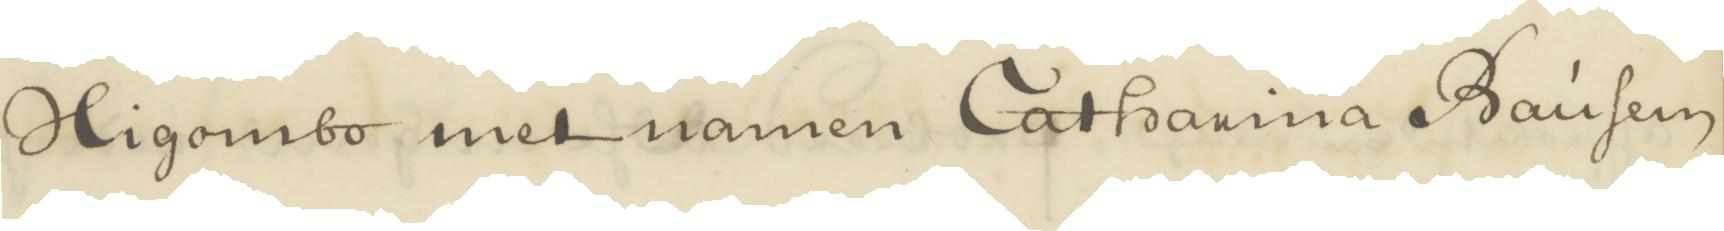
Higombo met namen Catharina Bausem
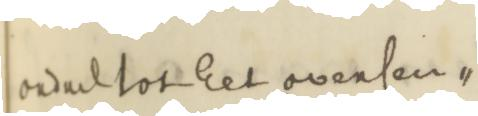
ordre tot het oversen„
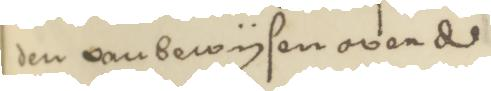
den van bewijsen over de
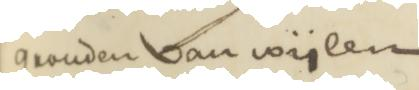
gronden van wijlen
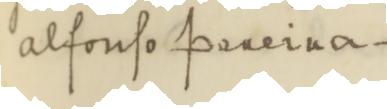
alfonso pereira
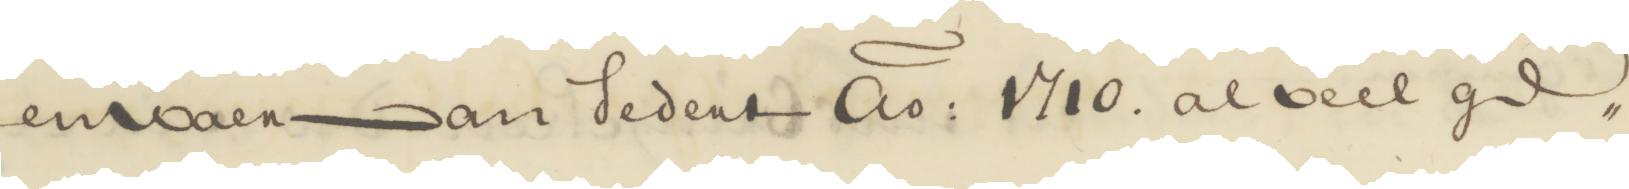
en waer van sedert ao: 1710. al veel ge„
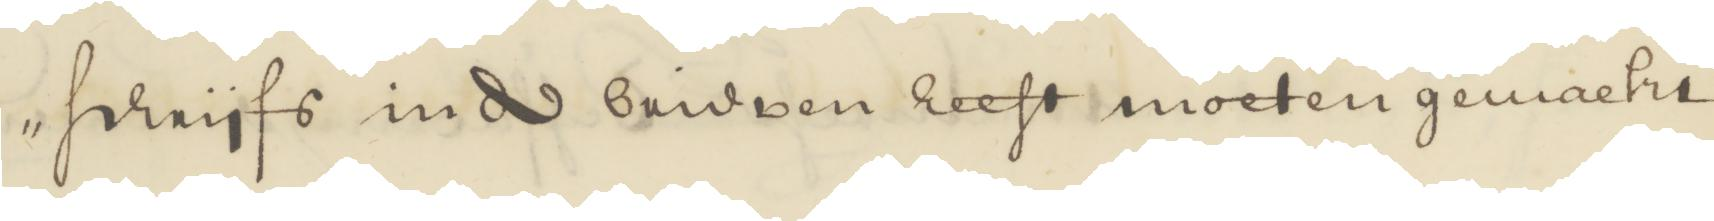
„schrijfs in de brieven heeft moeten gemaekt
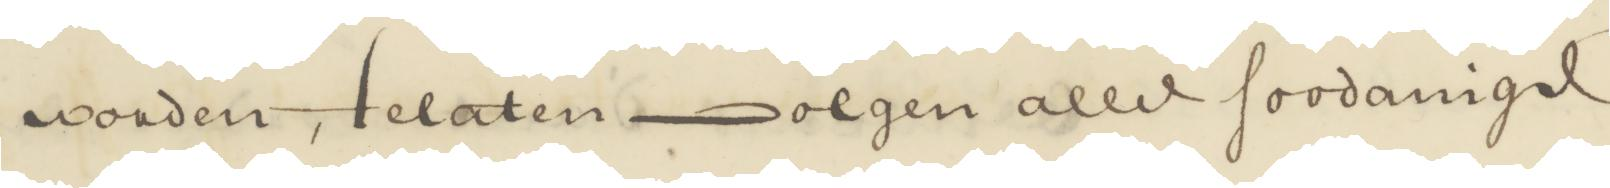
worden, telaten volgen alle soodanige
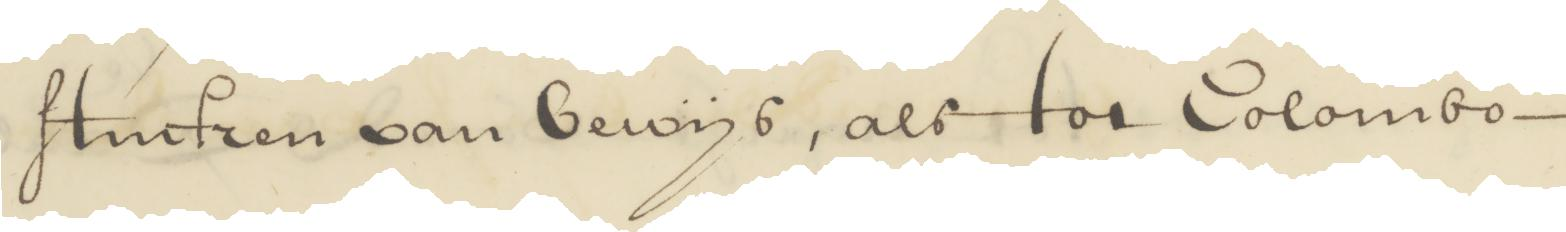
stucken van bewijs, als tot Colombo
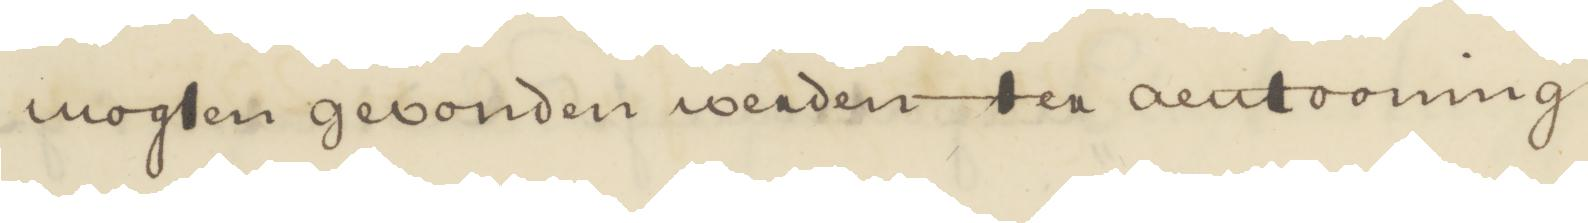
mogten gevonden werden ter aentooning
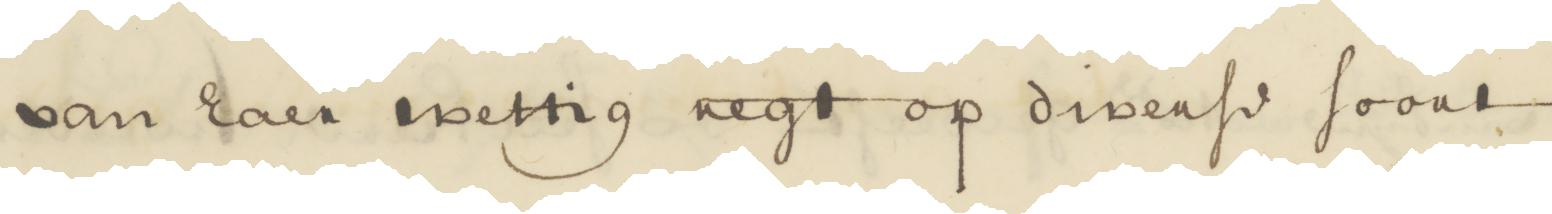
van haer wettig regt op diverse soort
